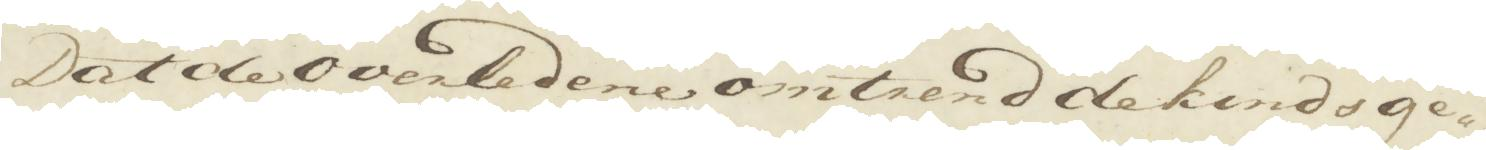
Dat de overledene omtrend de kinds ge„
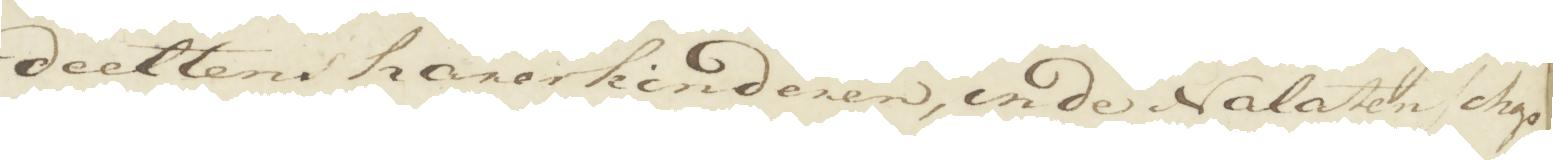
deeltens harer kinderen, en de Nalatenschap
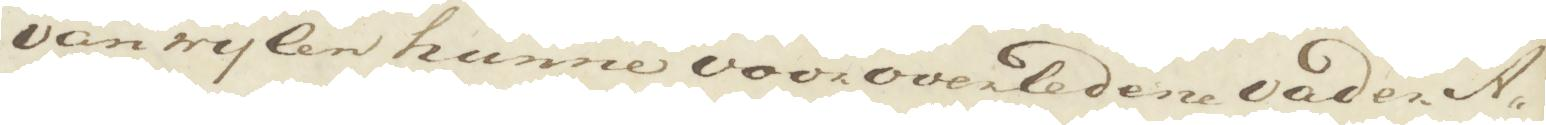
van wylen hunne voor overledene vader A„
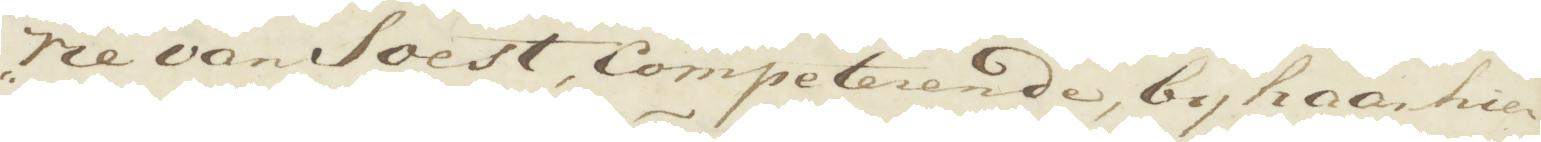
„rie van Soest, Competerende, by haar hier
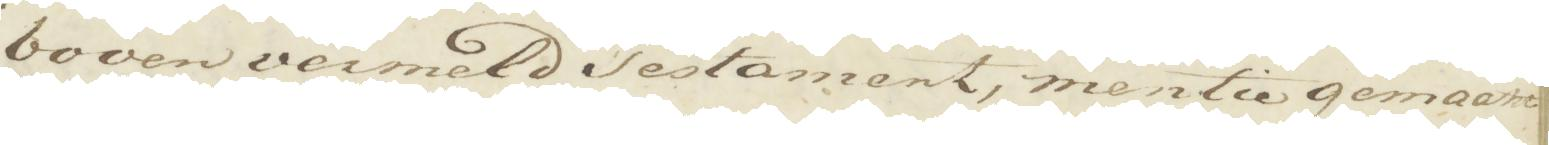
boven vermeld Testament, mentie gemaakt
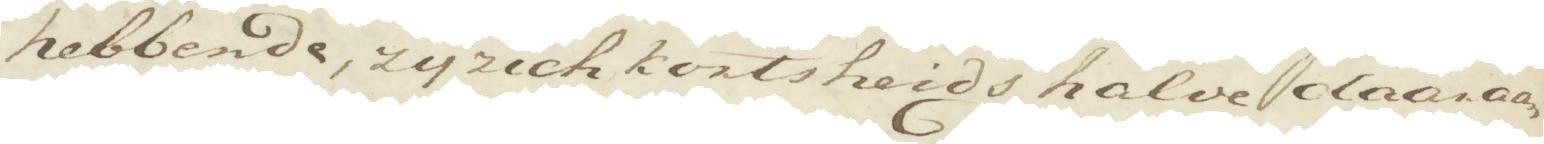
hebbende, zy zich kortsheids halve daar aan
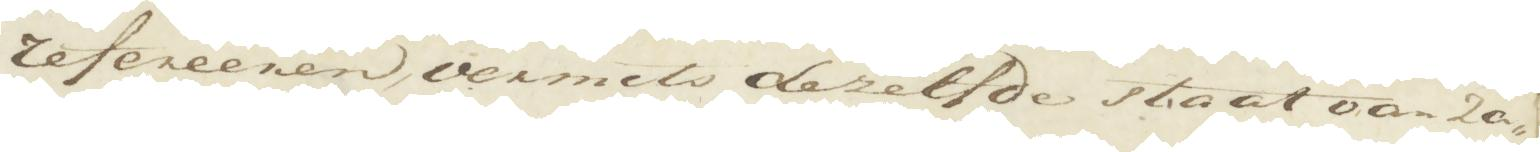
refereeren, vermits dezelfde staat van za„
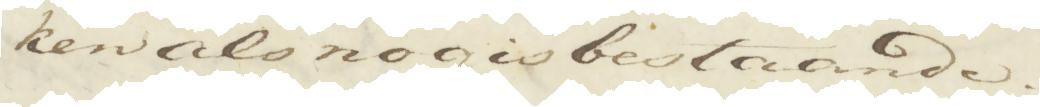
ken als nog is bestaande.
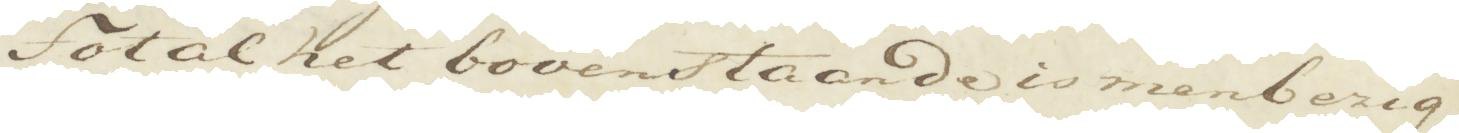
Tot al het bovenstaande is men bezig
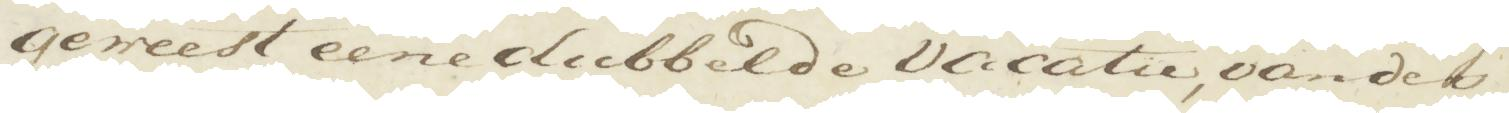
geweest eene dubbelde vacatie, van den
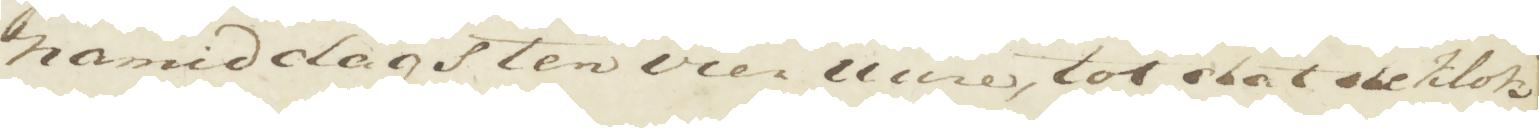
namiddags ten vier uure, tot dat de klok
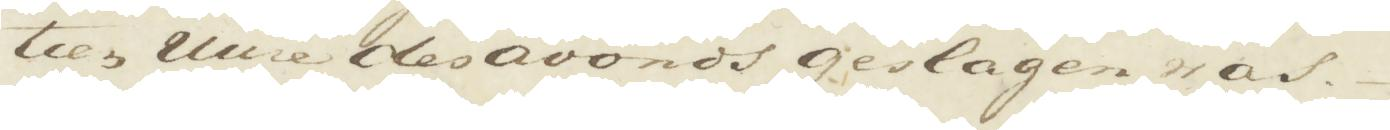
tien uure des avonds geslagen was.
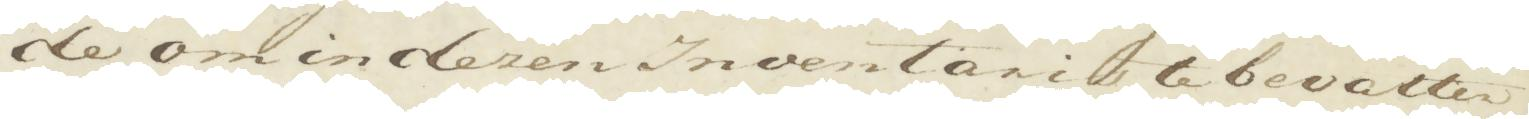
de om in dezen Inventaris te bevatten
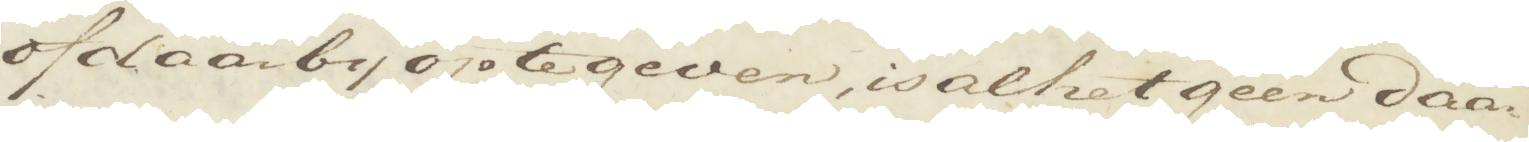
of daar by op te geven, is al het geen daar
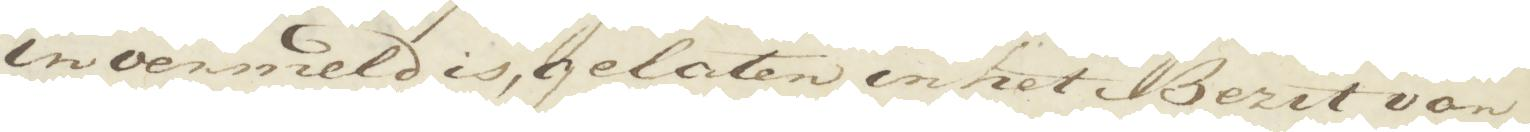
in vermeld is, gelaten en het Bezit van
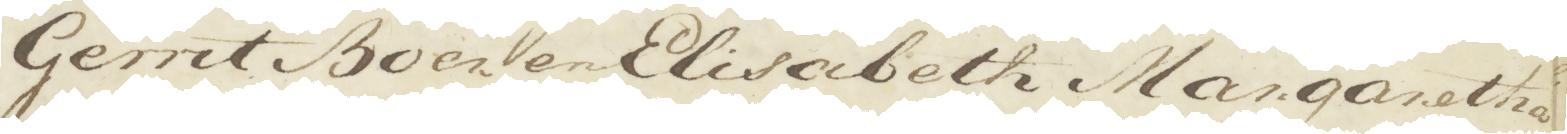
Gerrit Boer en Elisabeth Margaretha
